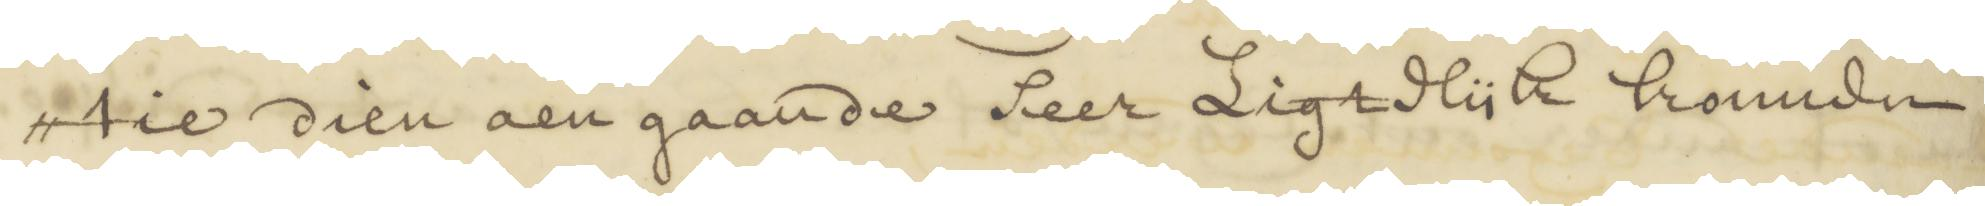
„tie dien aen gaande seer Ligtelijk konnen
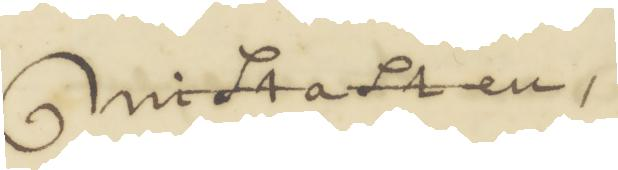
mistasten,
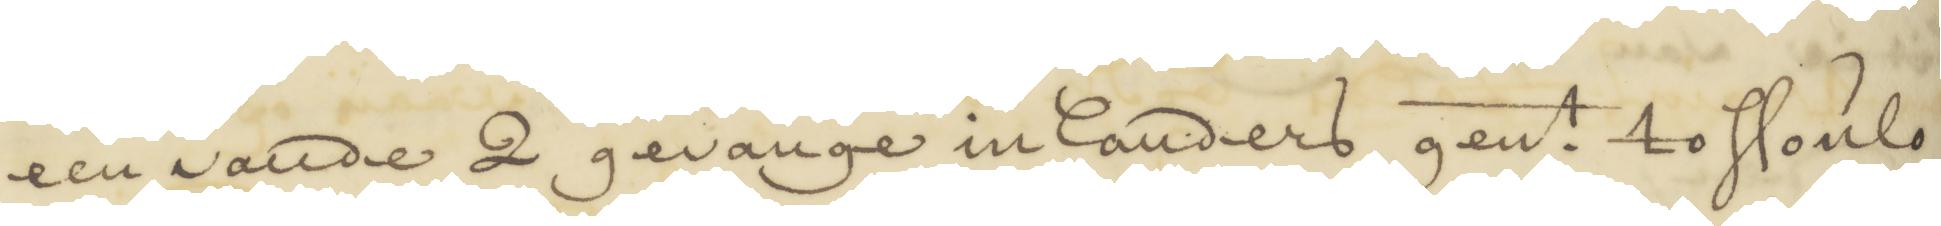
een vande 2 gevange inlanders gen:t tossoulo
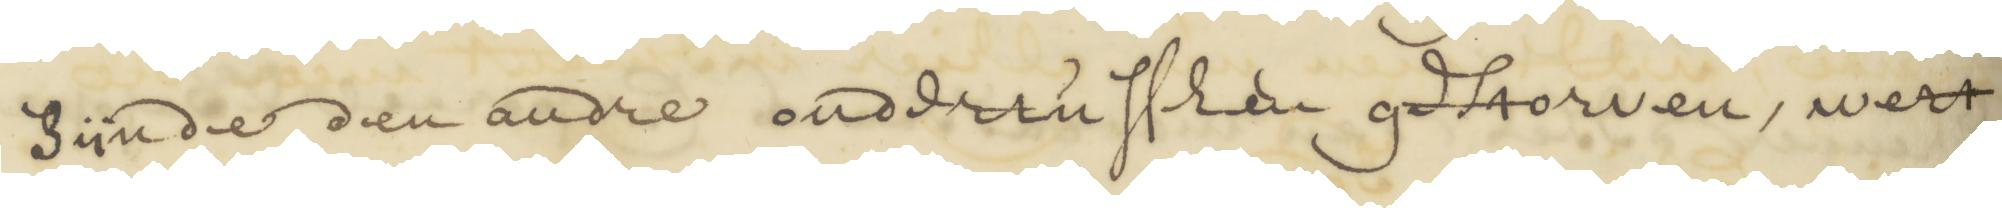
sijnde den andre ondertusshen gestorven, wert
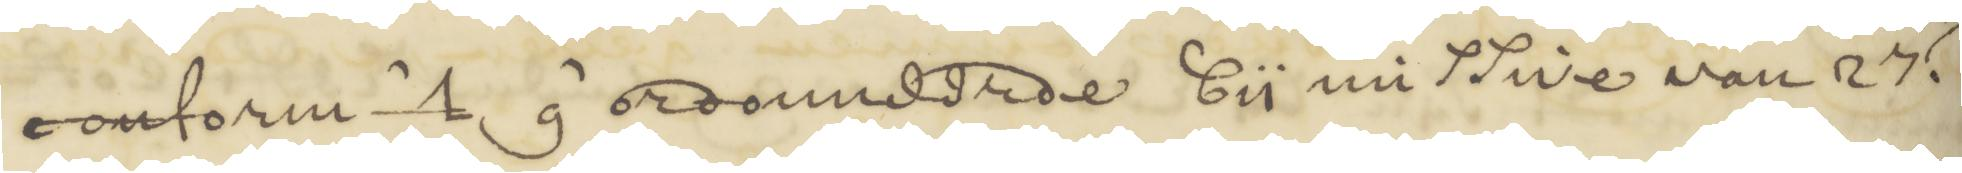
conform 't g’ordonneerde bij missive van 27„'
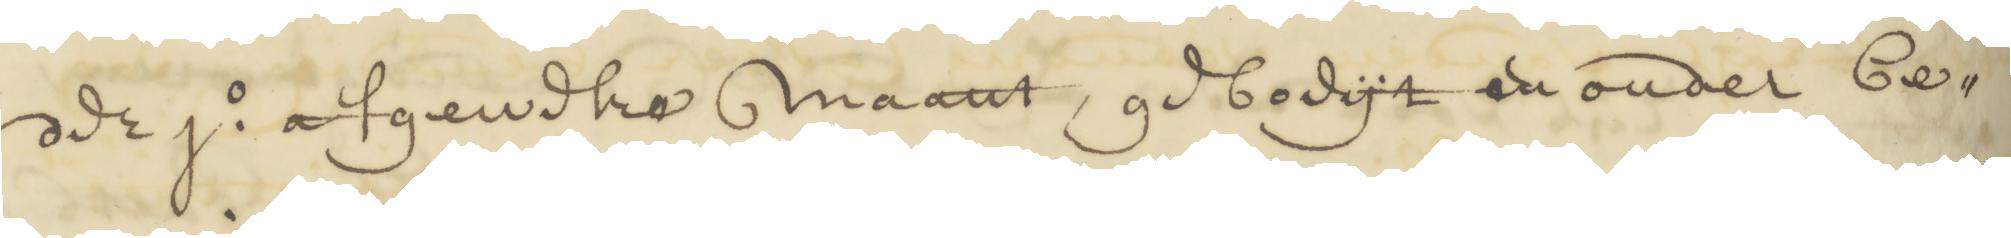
der j„o afgeweke Maant, geboeijt en onder be„
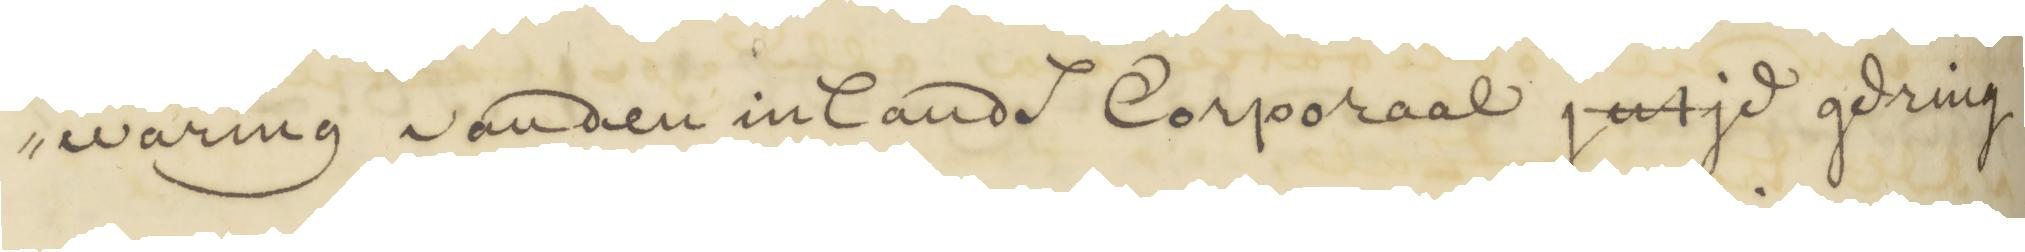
„waring van den inlands Corporaal jntje gering
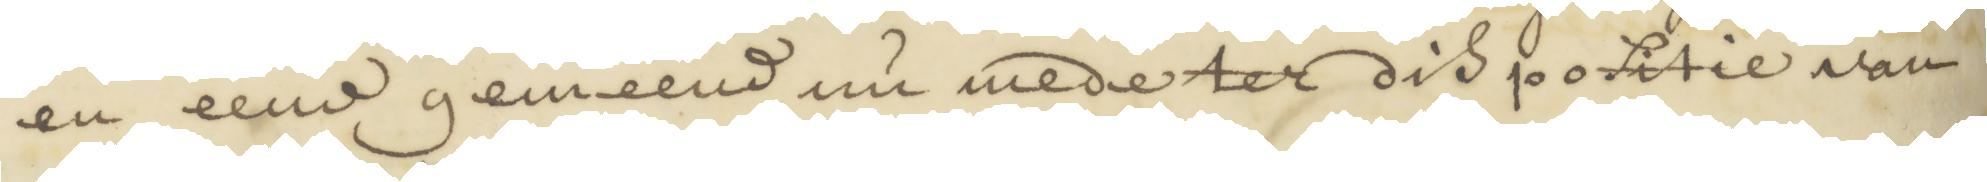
en eene gemeene nu mede ter dispositie van
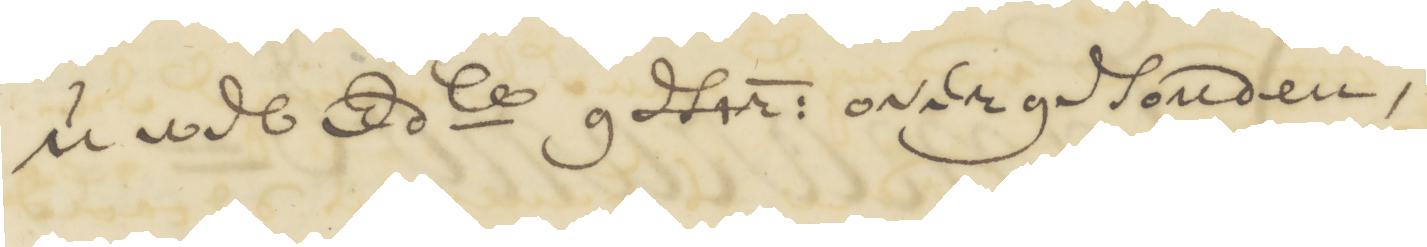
u wel Ed-le gestr: over gesonden,
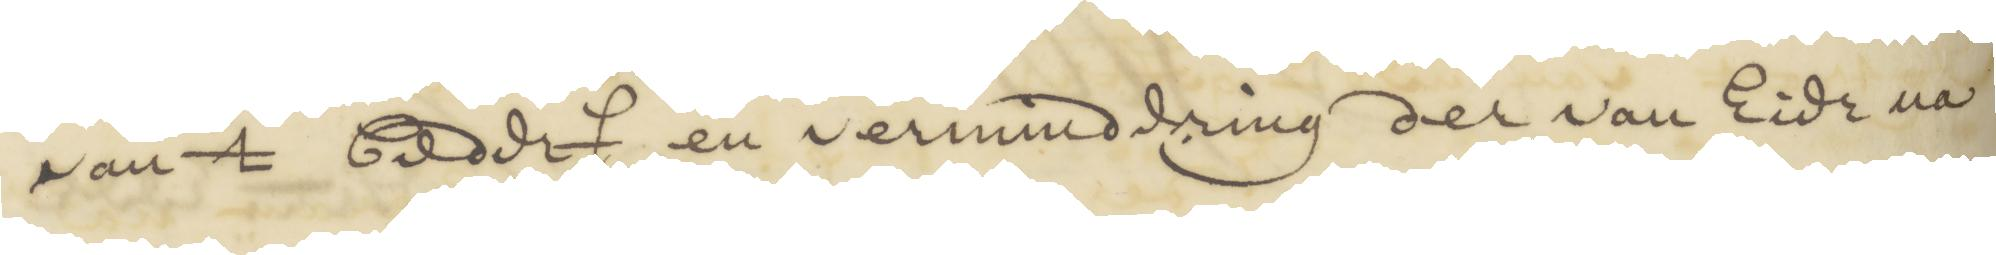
van ’t bederf en vermindering der van hier na
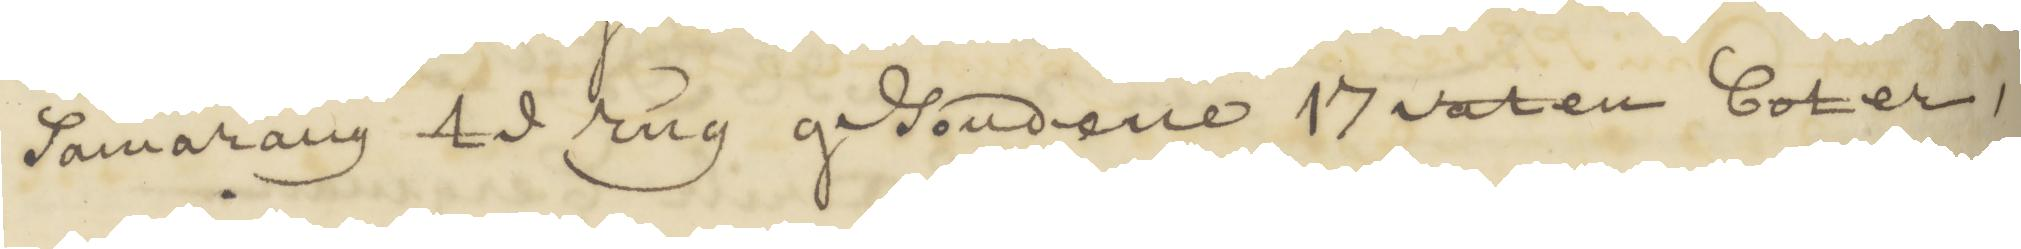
samarang te rug gesondene 17 vaten boter,
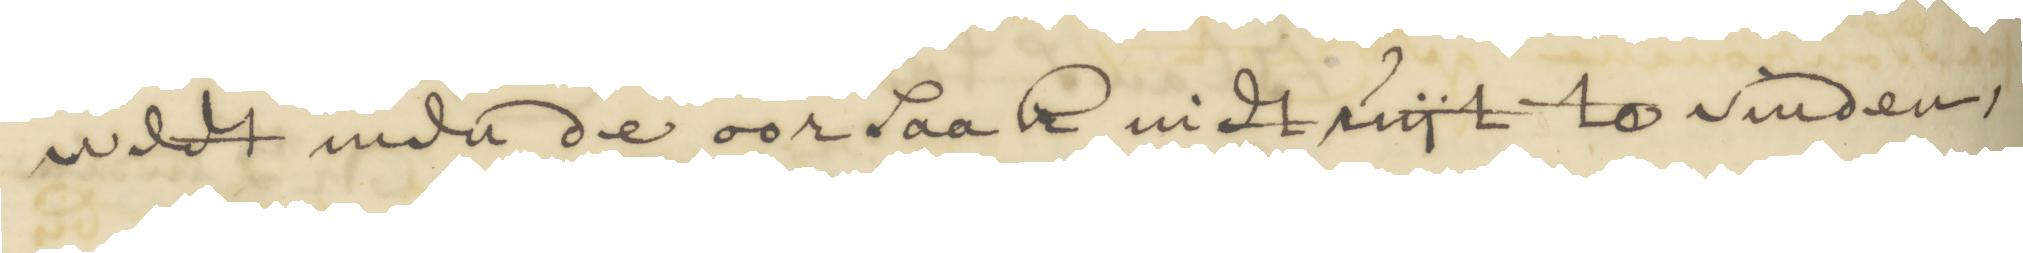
weet men de oorsaak niet uijt te vinden,
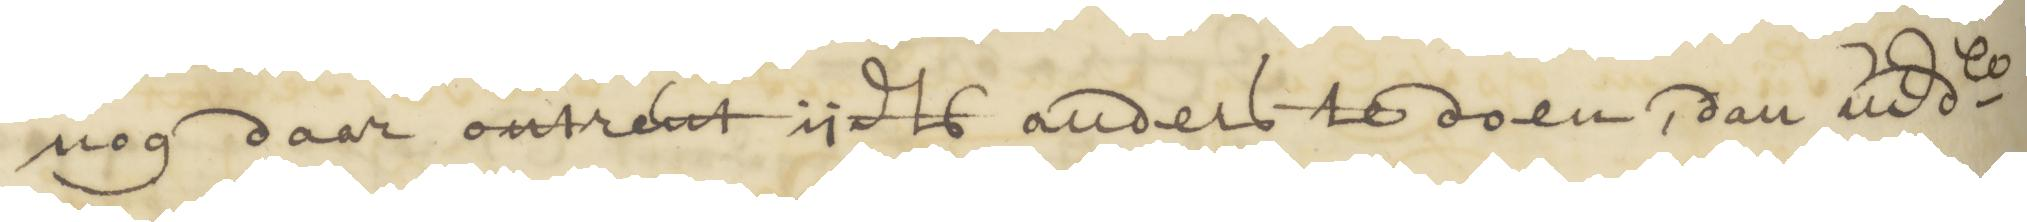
nog daar ontrent ijets anders te doen, dan u Ed-le
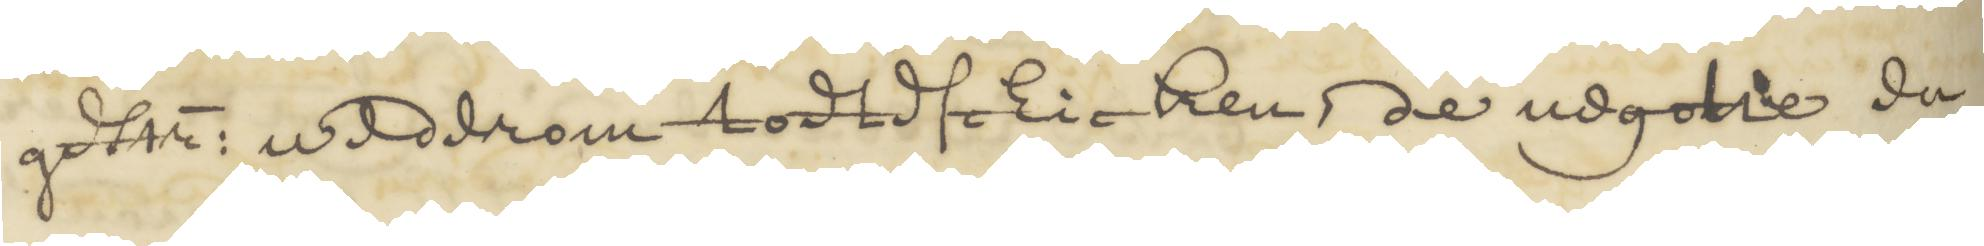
gestr: wederom toe te schicken, de negotie en
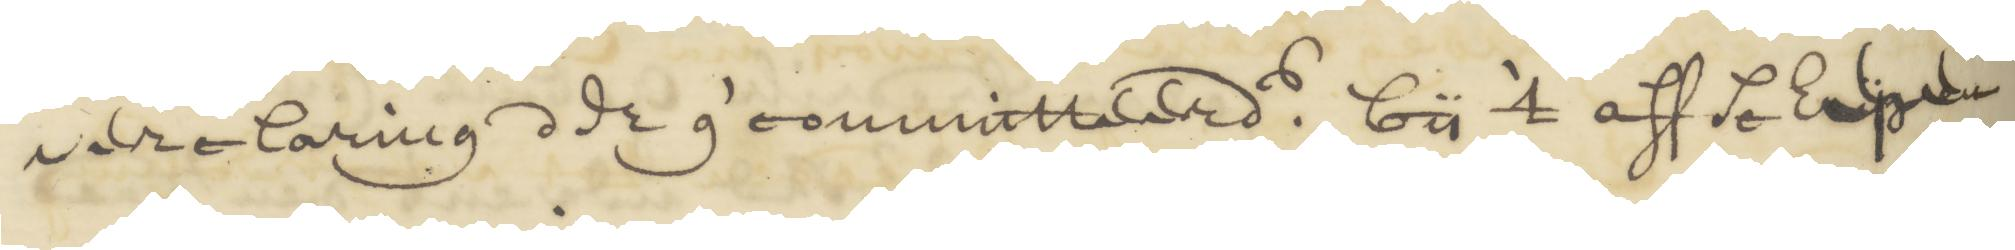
verclaring der g’committeerd„s bij ’t affschepen
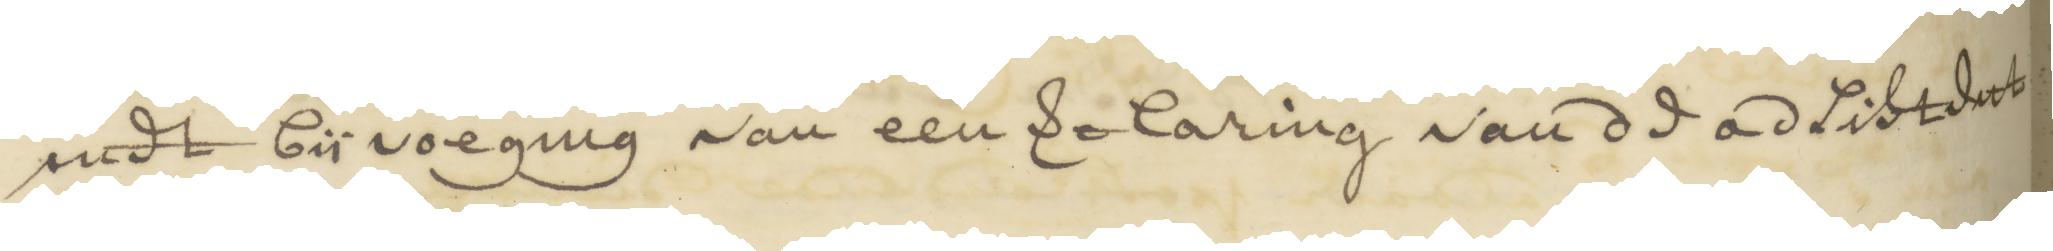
met bij voeging van een verclaring van de adsistent
